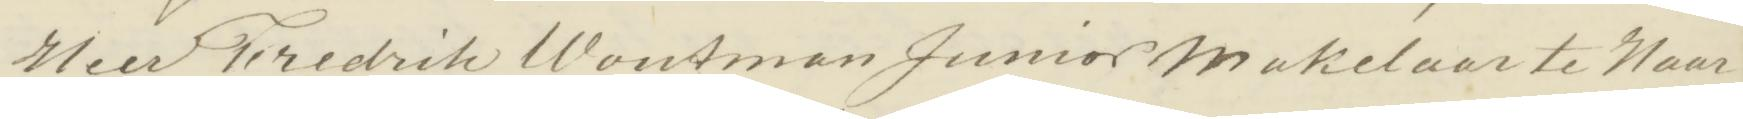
Heer Fredrik Woutman Junior Makelaar te Haar
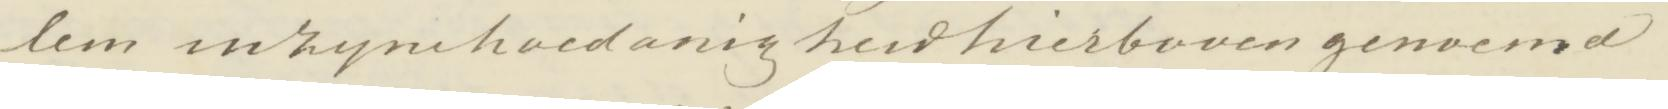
lem in zyne hoedanigheid hierboven genoemd
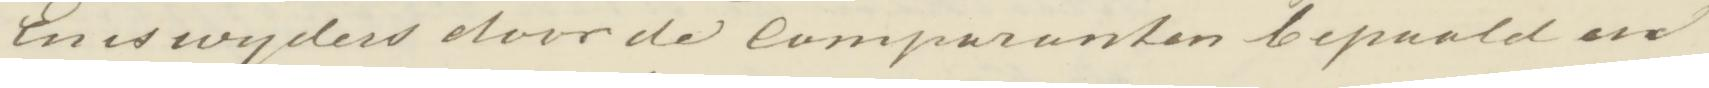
En is wyders door de Comparanten bepaald en
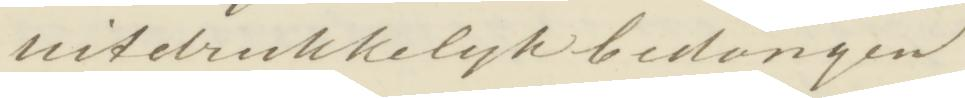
uitdrukkelyk bedongen
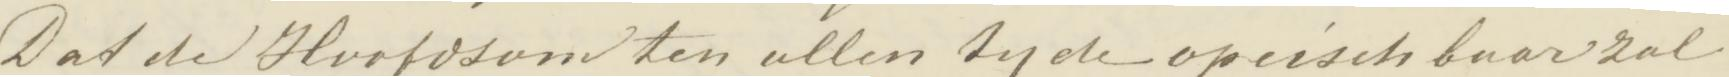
Dat de Hoofdsom ten allen tyde opeischbaar zal
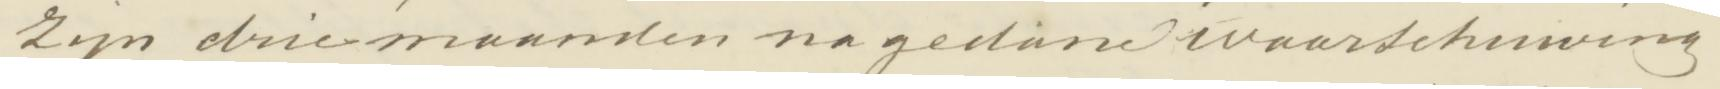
zijn drie maanden na gedane waarschuwing
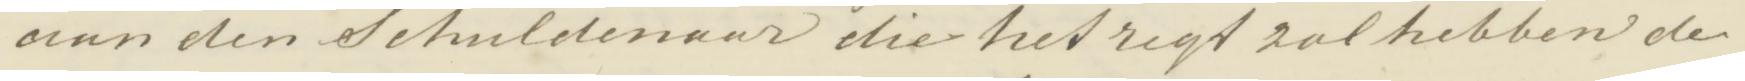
aan den schuldenaar die het regt zal hebben de
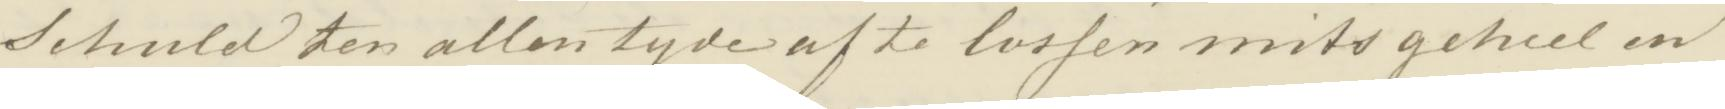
schuld ten allen tyde af te lossen mits geheel en
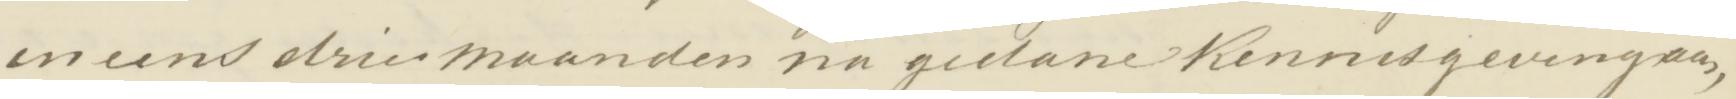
in eens drie maanden na gedane kennisgeving aan,
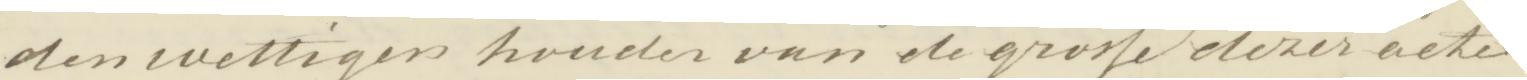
den wettigen houder van de grosse dezer acte
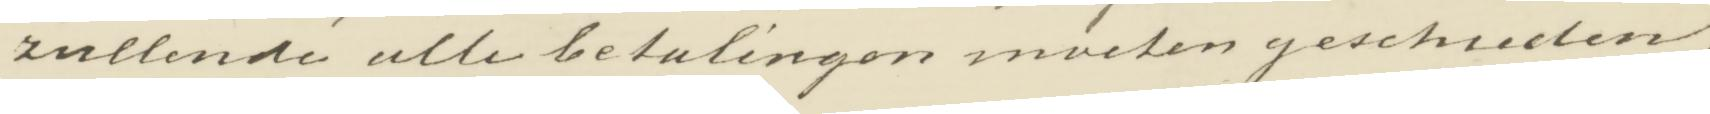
zullende alle betalingen moeten geschieden
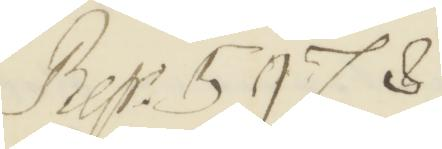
Rep: 5978
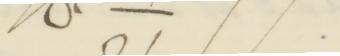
18 11/24 77.
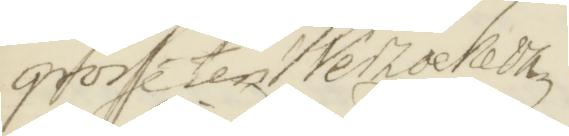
grosse ten Verzoeke van
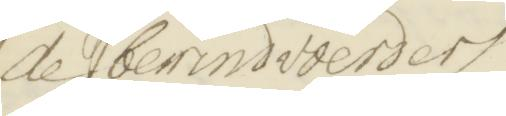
de bewindvoerders
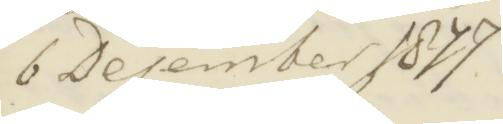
6 December 1877
